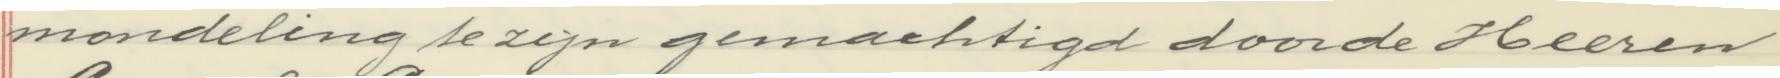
mondeling te zijn gemachtigd door de Heeren
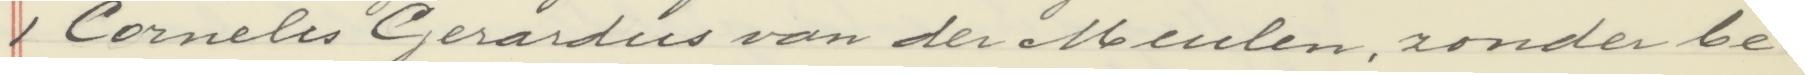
1 Cornelis Gerardus van der Meulen, zonder be-
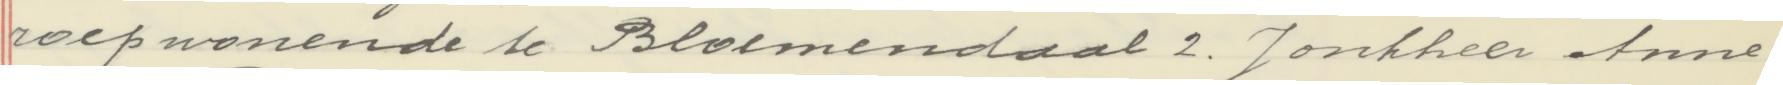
roep wonende te Bloemendaal 2. Jonkheer Anne
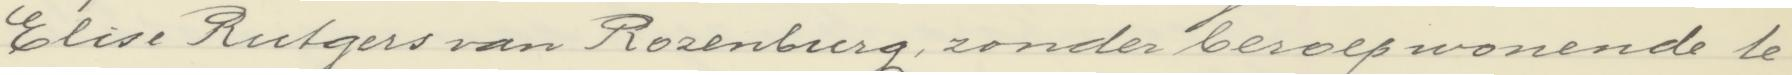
Elise Rutgers van Rozenburg, zonder beroep wonende te
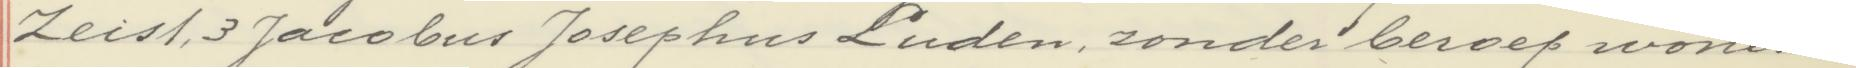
Zeist, 3 Jacobus Josephus Luden, zonder beroep wonen-
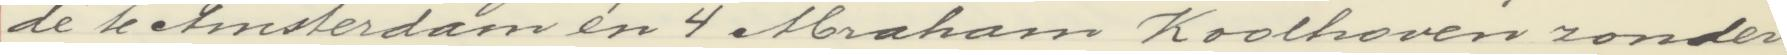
de te Amsterdam en 4 Abraham Koothoven zonder
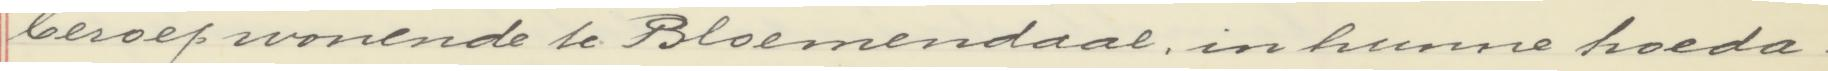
beroep wonende te Bloemendaal, in hunne hoeda
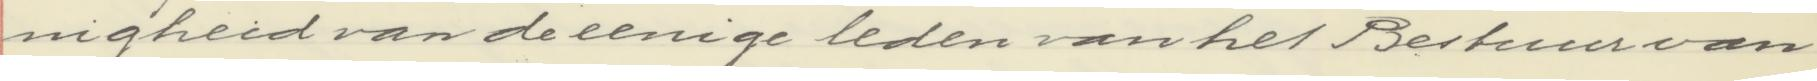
nigheid van de eenige leden van het Bestuur van
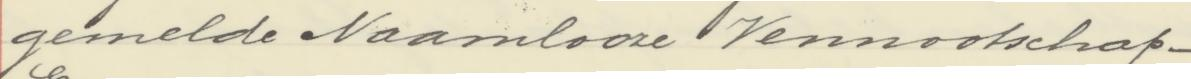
gemelde Naamlooze Vennootschap.
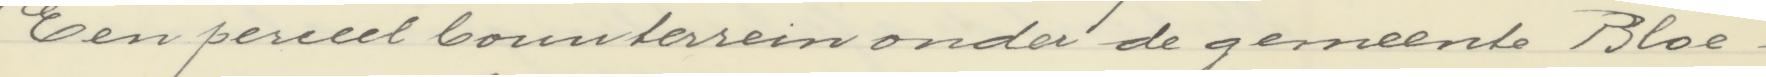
Een perceel bouwterrein onder de gemeente Bloe
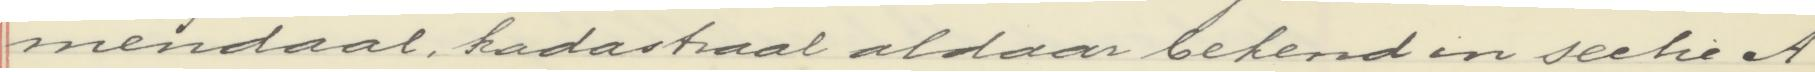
mendaal, kadastaal aldaar bekend in sectie A
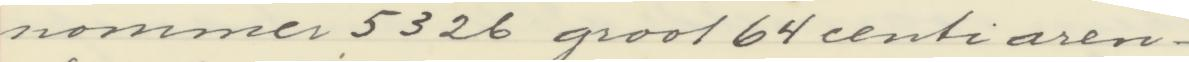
nommer 5326 groot 64 centiaren
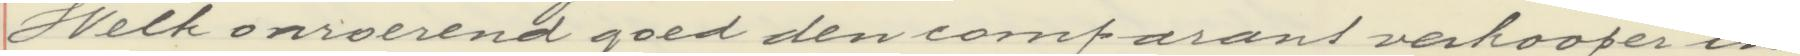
Welk onroerend goed den comparant verkooper in
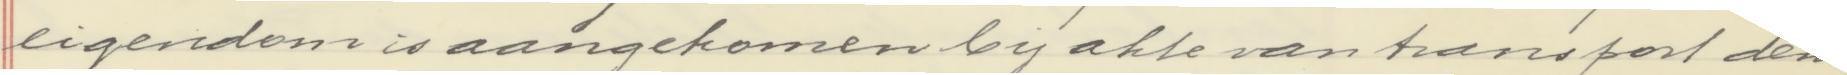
eigendom is aangekomen bij akte van transport den
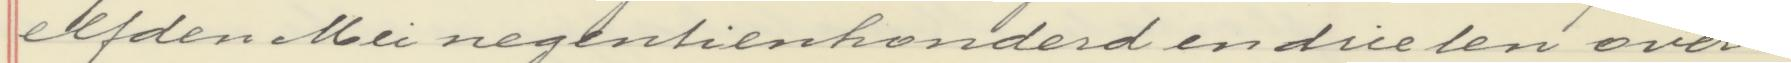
elfden Mei negentienhonderd en drie ten over-
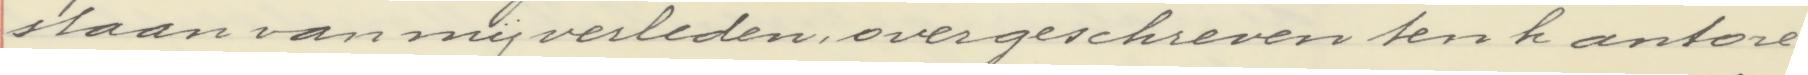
staan van mij verleden, overgeschreven ten kantore
